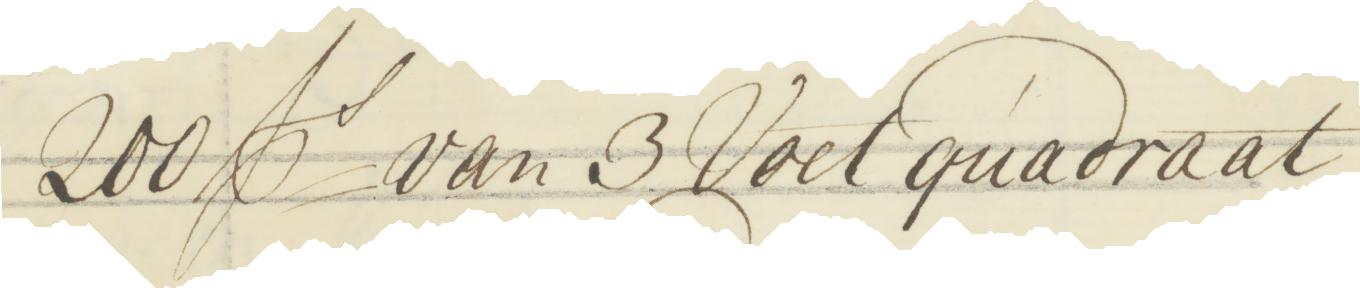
200 p=s van 3 Voet quadraat
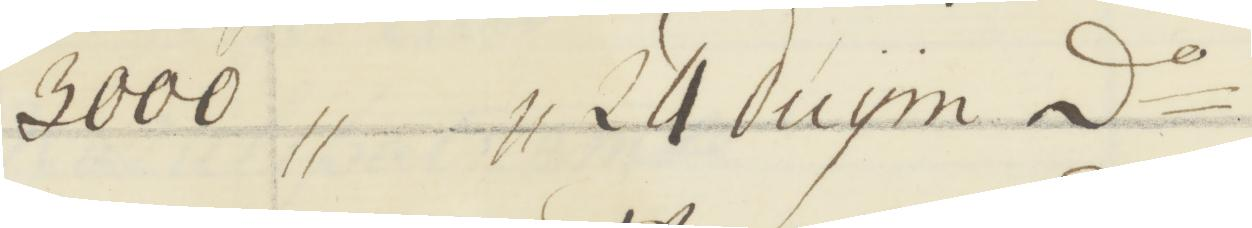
3000 „ „ 24 duijm D=o
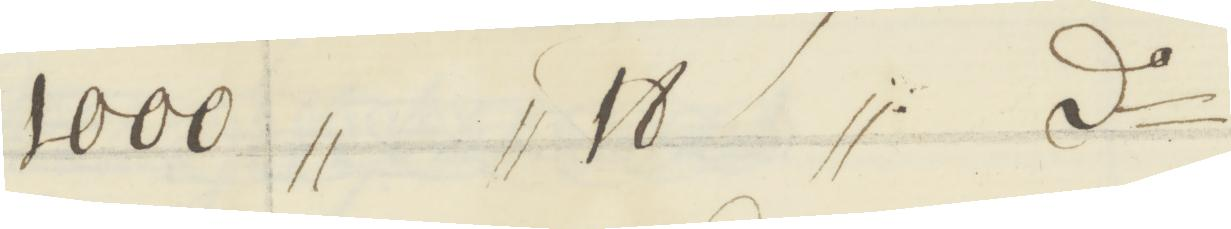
1000 „ „ 18 „ D=o
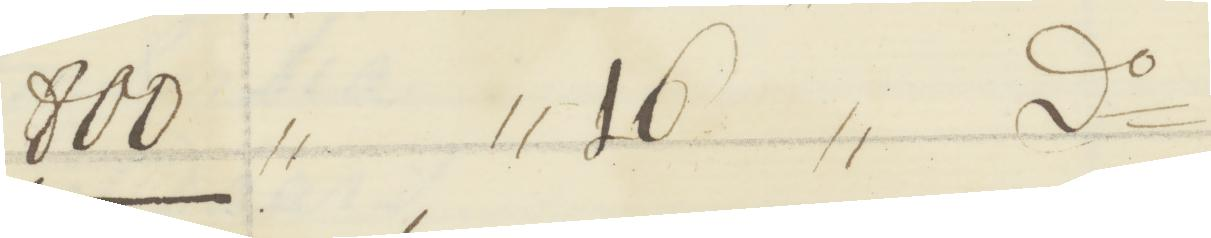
800 „ „ 16 „ D=o
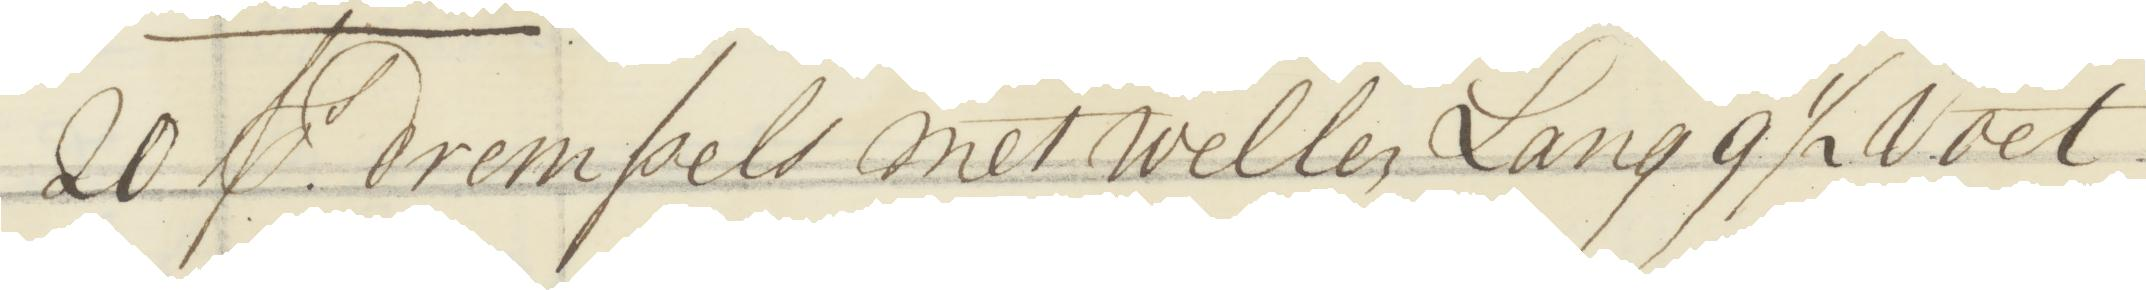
20 p.s drempels met wellen Lang 9½ voet
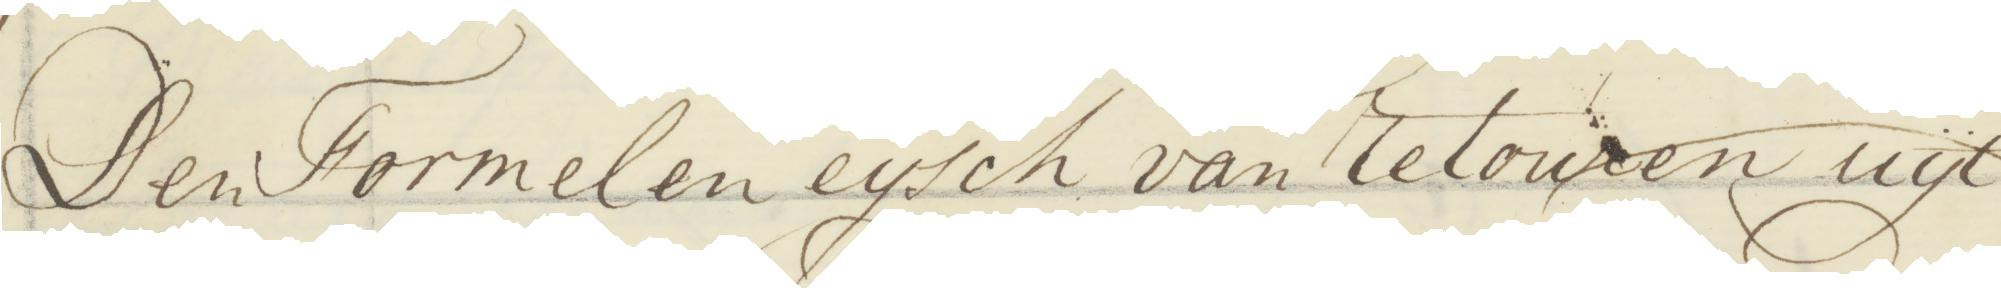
Den Formelen eijsch van Retouren uijt
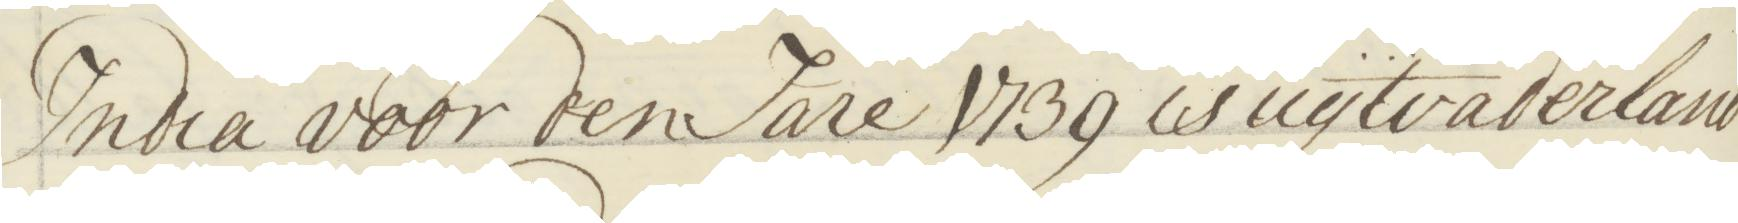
India voor den Iare 1739 is uijtvaderland
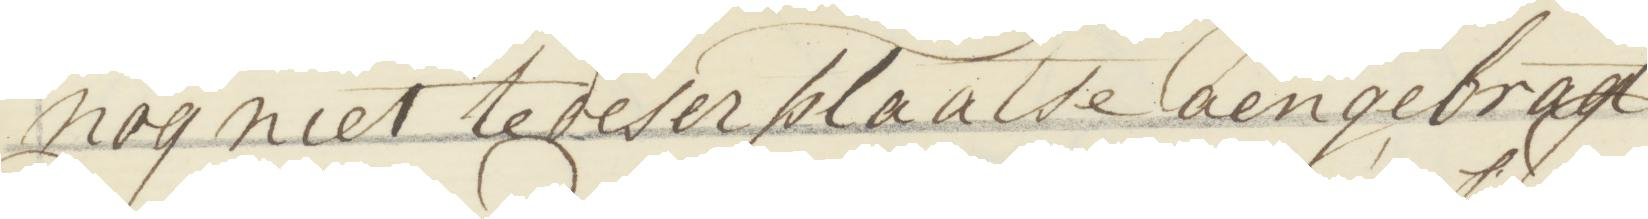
nog niet te deser plaatse aen gebragt
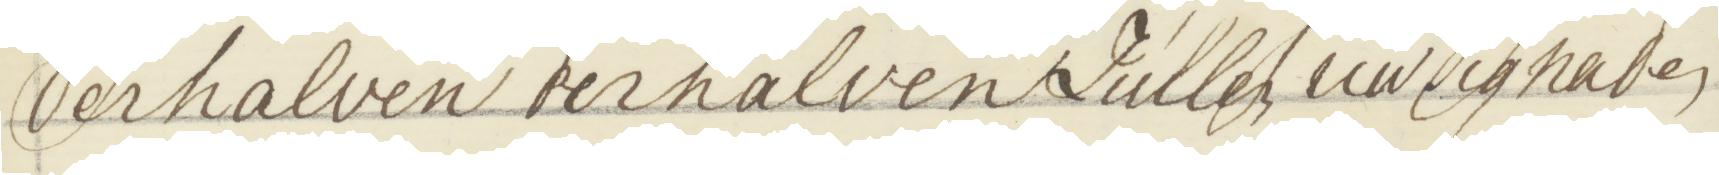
derhalven derhalven zullen uw sig naden
